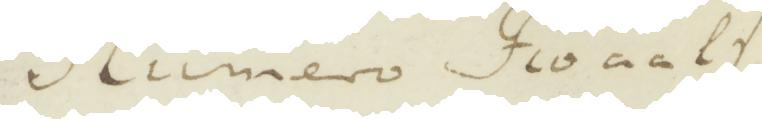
Numero Twaalf
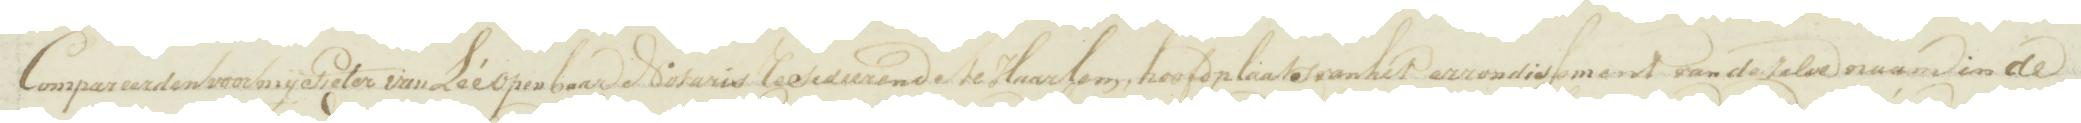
Compareerden voor mij Pieter van Lee Openbaar Notaris Resideerende te Haarlem, hoofdplaats van het arrondissement van dezelve naam in de
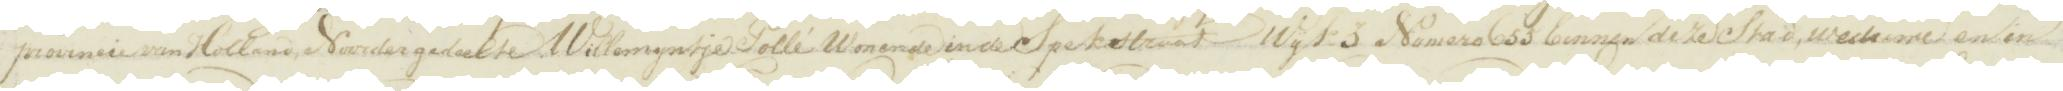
provincie van Holland, Noordergedeelte, Willemijntje Pollé Wonende in de Spekstraat Wijk 3 Numero 655 binnen deze Stad, weduwe en in
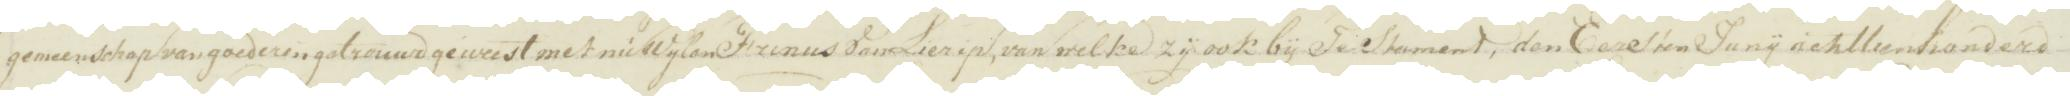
gemeenschap van goederen getrouwd geweest met nu Wijlen Trinus Van Lierip, van welke zij ook bij Testament, den Eersten Iunij achttienhonderd
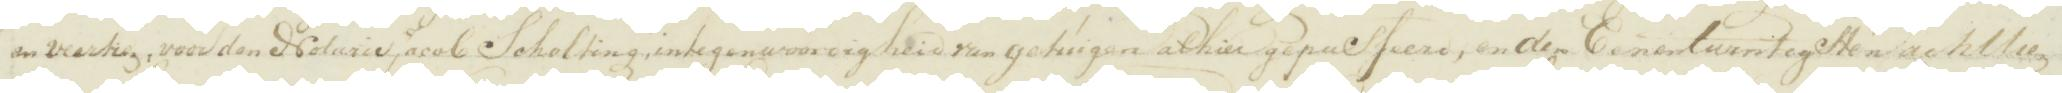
en veertig, voor den Notaris Jacob Scholting, integenwoordigheid van getuigen alhier gepasseerd, en den Eenentwintigsten achttien
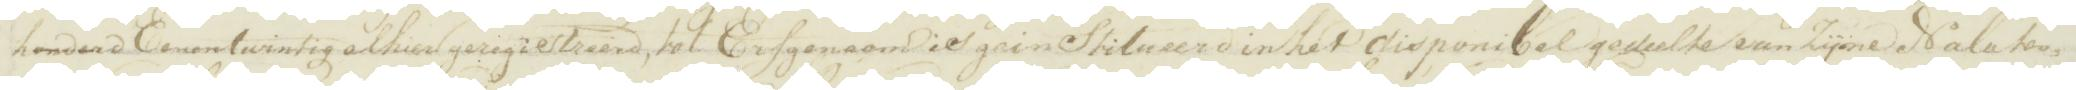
honderd Eenentwintig alhier geregistreerd, tot Erfgenaam is geinstitueerd in het disponibel gedeelte van Zijne Nalaten=
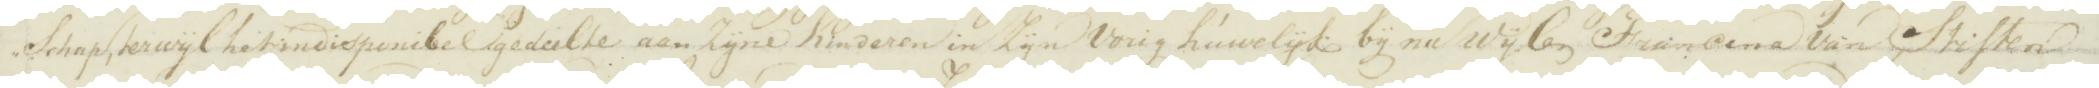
schap, terwijl het indisponibel gedeelte aan Zijne Kinderen in Zijn Vorig huwelijk bij nu wijlen Francina van Stiften
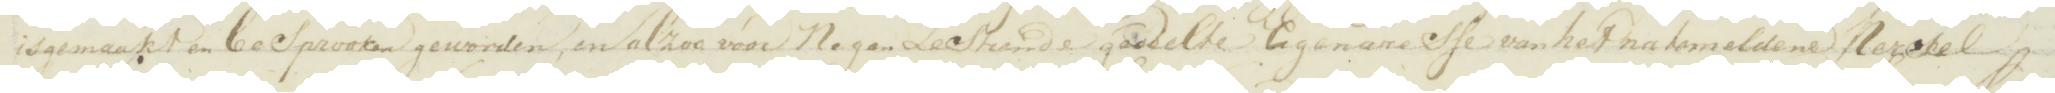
is gemaakt en besprooken geworden, en alzoo voor Negen Zestiende gedeelte Eigenaresse van het natemeldene Perceel
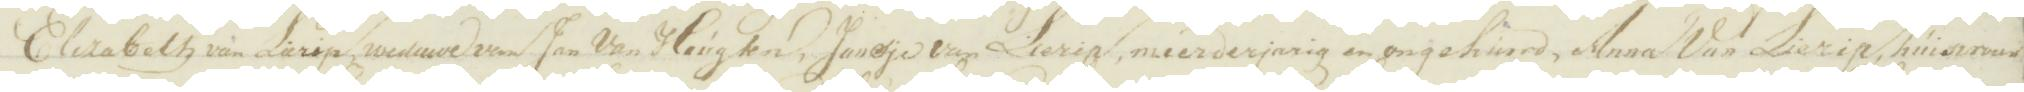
Elizabeth van Lierip, weduwe van Jan Van Heugten, Jansje van Lierip, meerderjarig en ongehuwd, Anna Van Lierip, huisvrouw
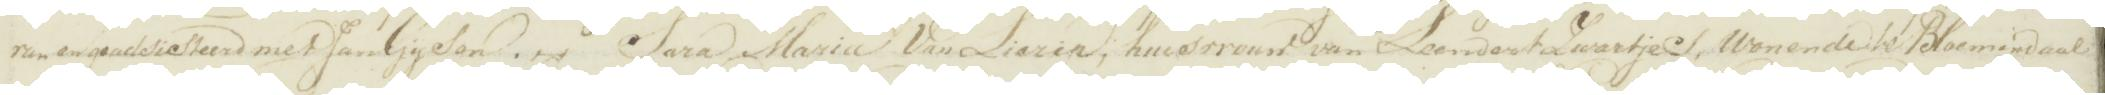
van en geadsisteerd met Jan Gijsen, Sara Maria Van Lierip, huisvrouw van Leendert Zwantjes, wonende te Bloemendaal
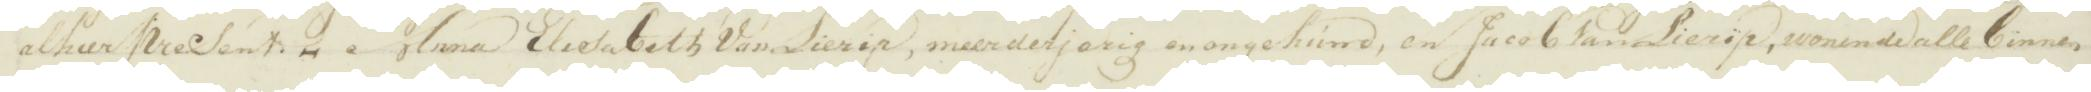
alhier present. _ Anna Elisabeth Van Lierip, meerderjarig en ongehuwd, en Jacob van Lierip, wonende alle binnen
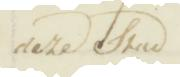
deze stad
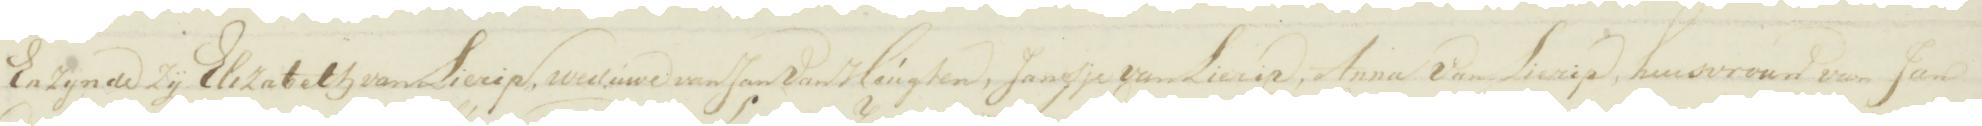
En zijnde zij Elizabeth van Lierip, weduwe van Jan Van Heugten, Jansje van Lierip, Anna Van Lierip, huisvrouw van Jan
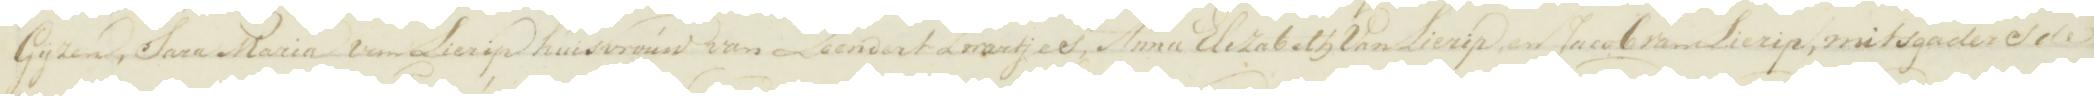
Gijzen, Sara Maria van Lierip huisvrouw van Leendert Zwartjes, Anna Elizabeth van Lierip, en Jacob van Lierip, mitsgaders de
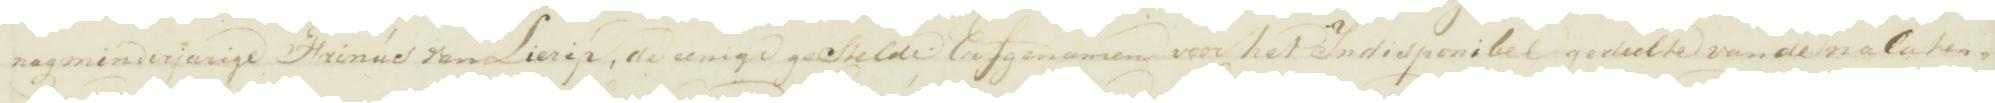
nog minderjarige Trinus van Lierip, de eenige gestelde Erfgenamen voor het Indisponibel gedeelte van de nalaten,
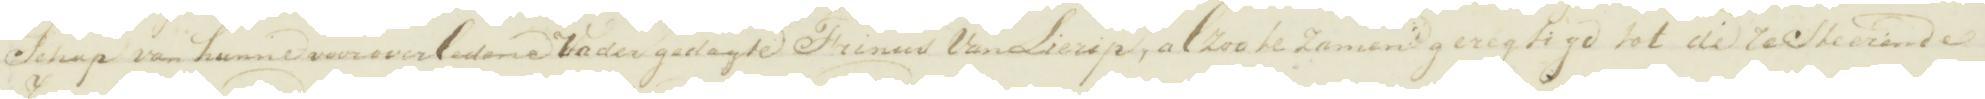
schap van hunne voor overledene Vader gedagte Trinus van Lierip, alzoo te zamen geregtigd tot de resteerende
